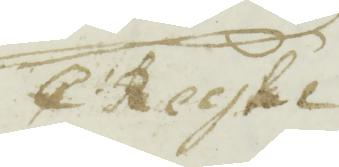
P: Rijke
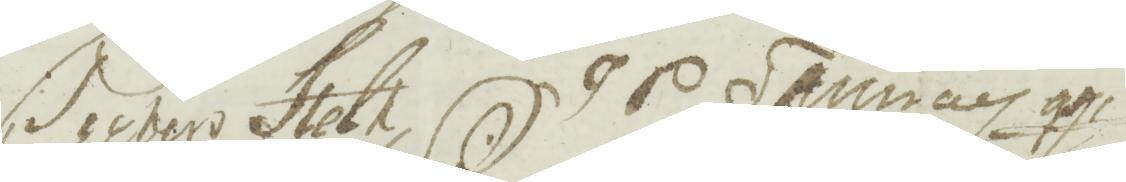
Pieter Stelt, I P Tannay ap
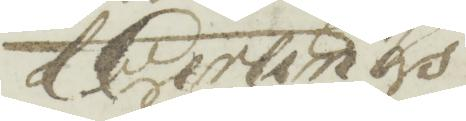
C.Gerlings
